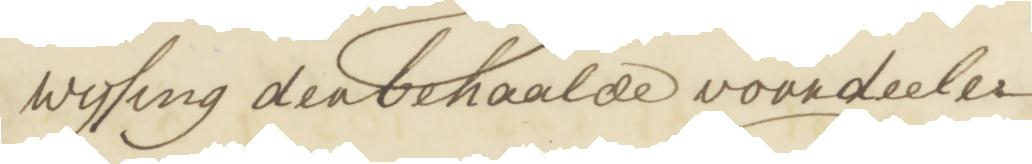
wysing der behaalde voordeelen
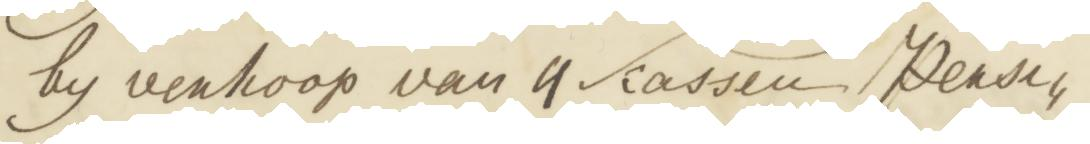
by verkoop van 4 kassen Persi„
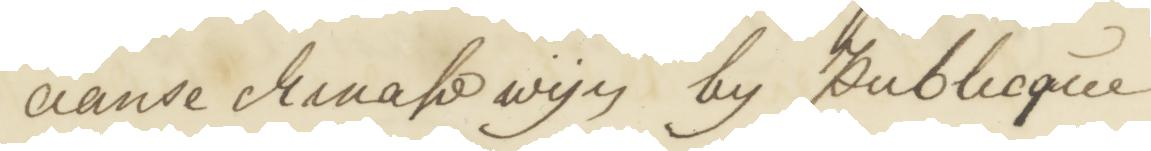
aanse chinase wijn by Publicque
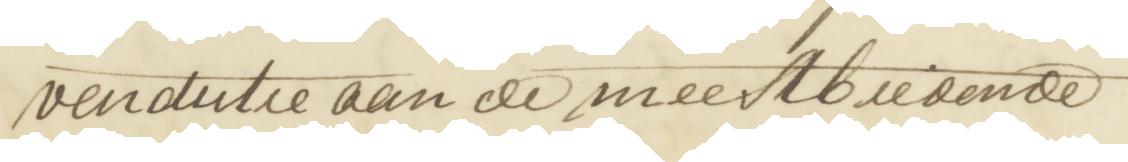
vendutie aan de meest biedende
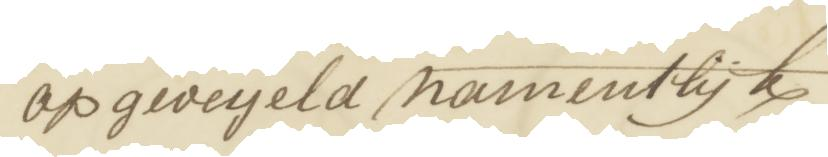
op geveyeld namentlijk
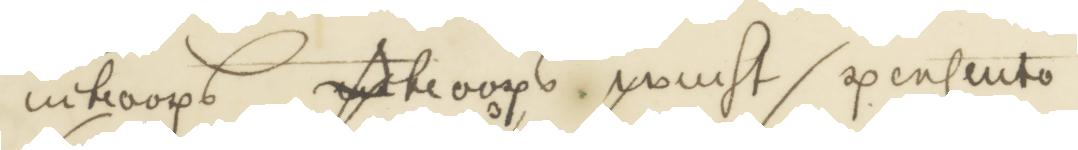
inkoops verkoops winst perCento
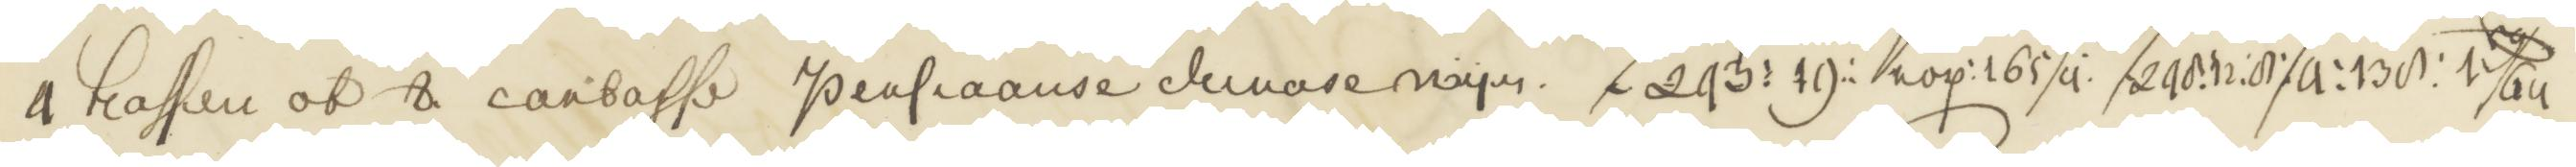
4 kassen of 8. carbasse Persiaanse chinase wijn. ƒ243: 19.: rop: 165¾: ƒ248:12:8. ƒ4: 138: 1 59/64
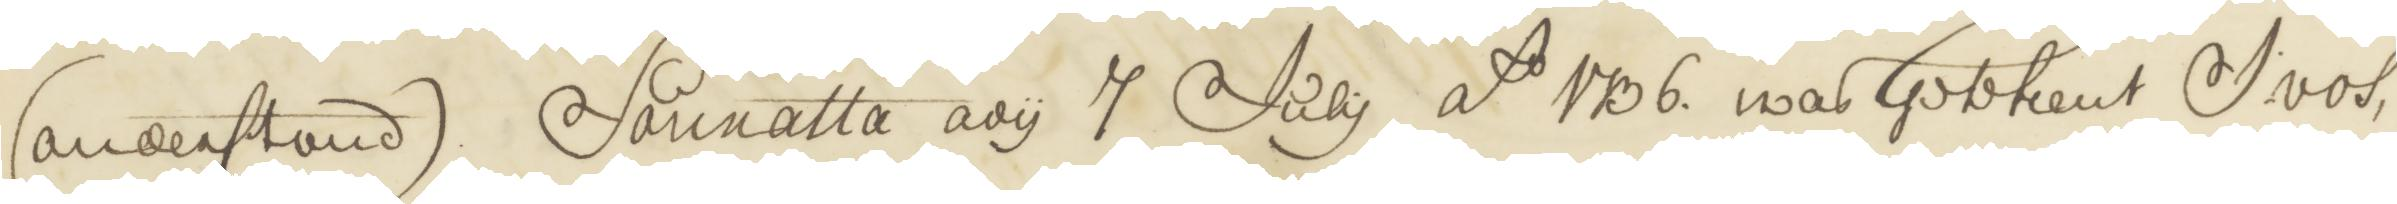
(onderstond) Souratta adij 7 Iulij ao 1736. was Getekent I: vos,
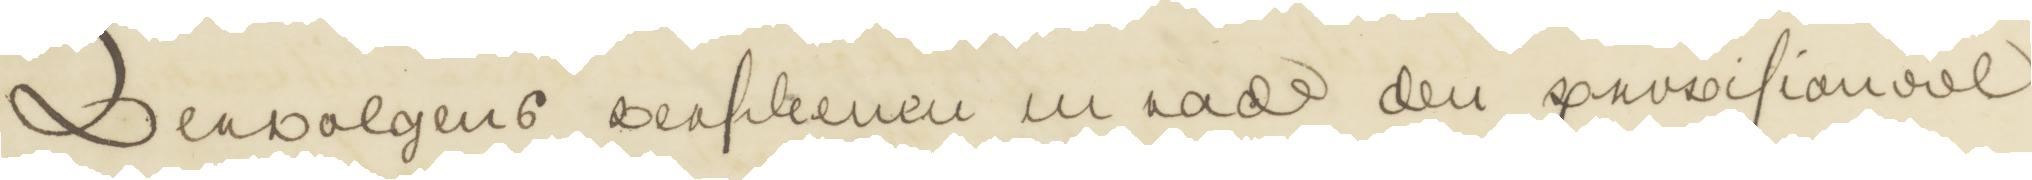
Vervolgens verschenen in rade den provisioneel
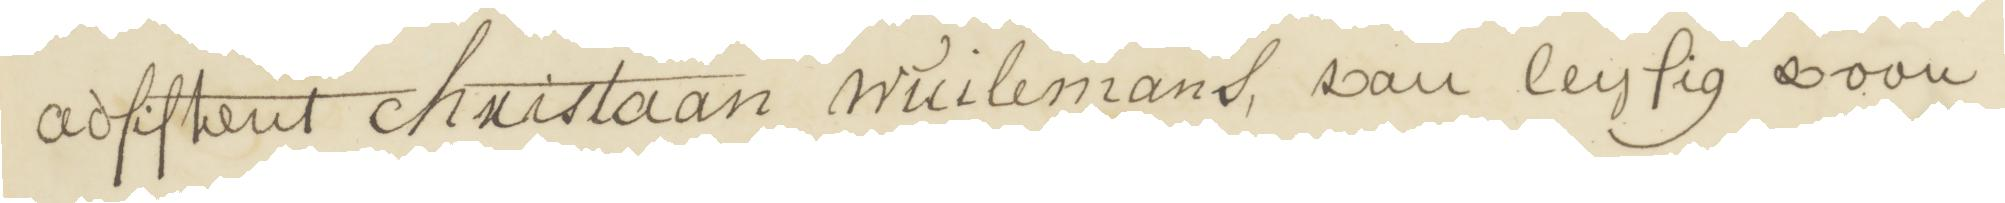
adsistent christaan wuilemans, van leysig voor
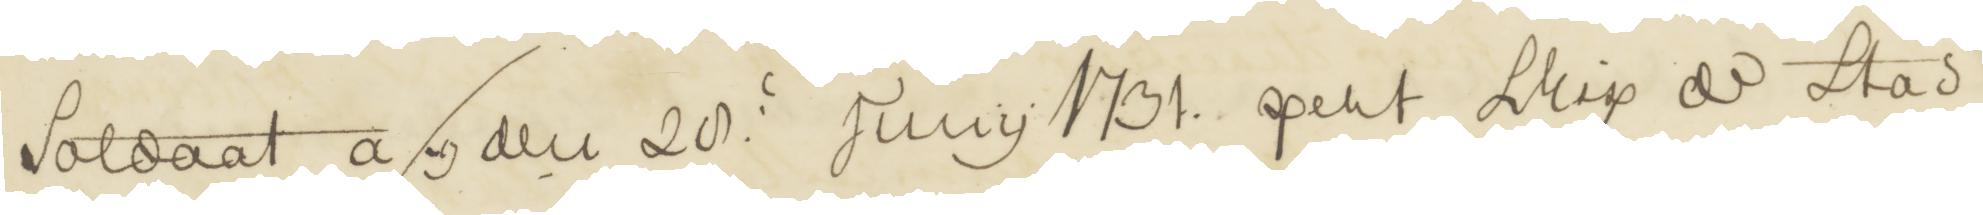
soldaat a den 28:' Junij 1731. pert schip de stad
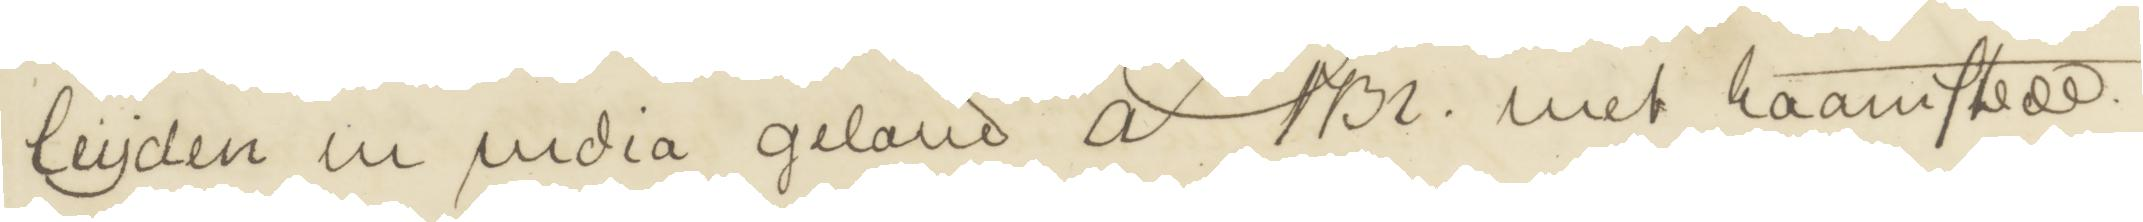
leijden in india geland ao 1732. met haamstede.
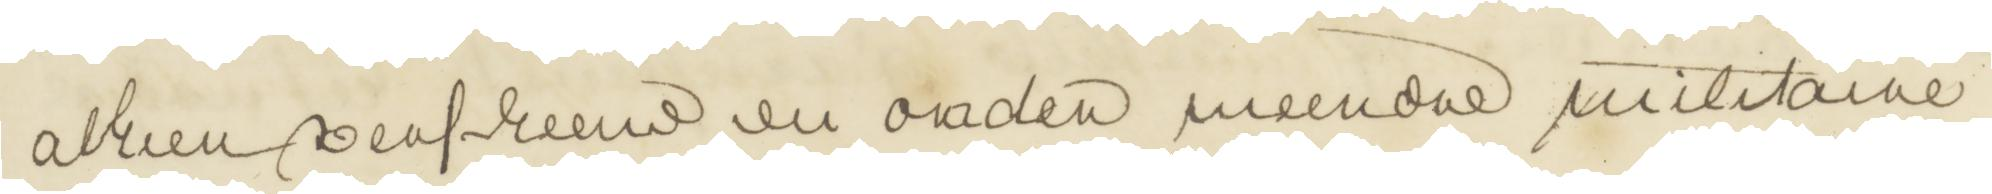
alhier verscheene en onder meer die militaire
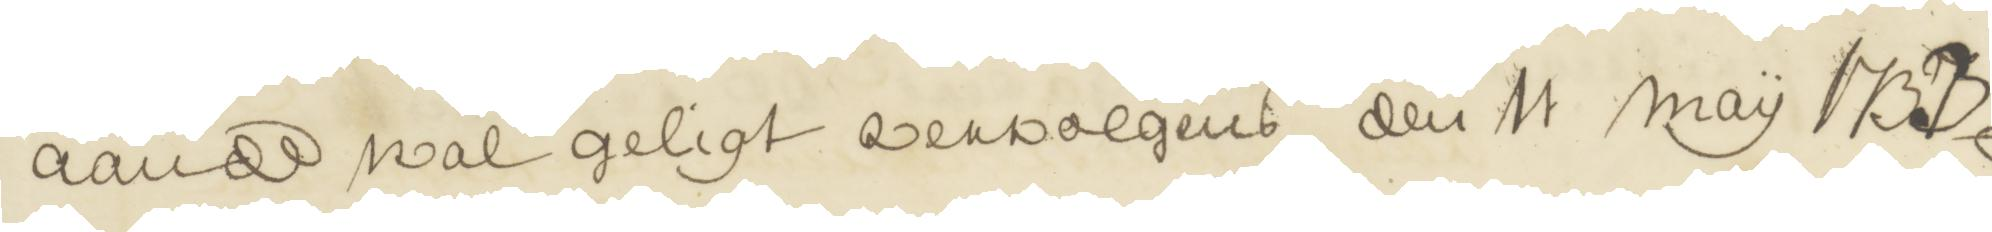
aande wal geligt vervolgens den 11 maij 1733
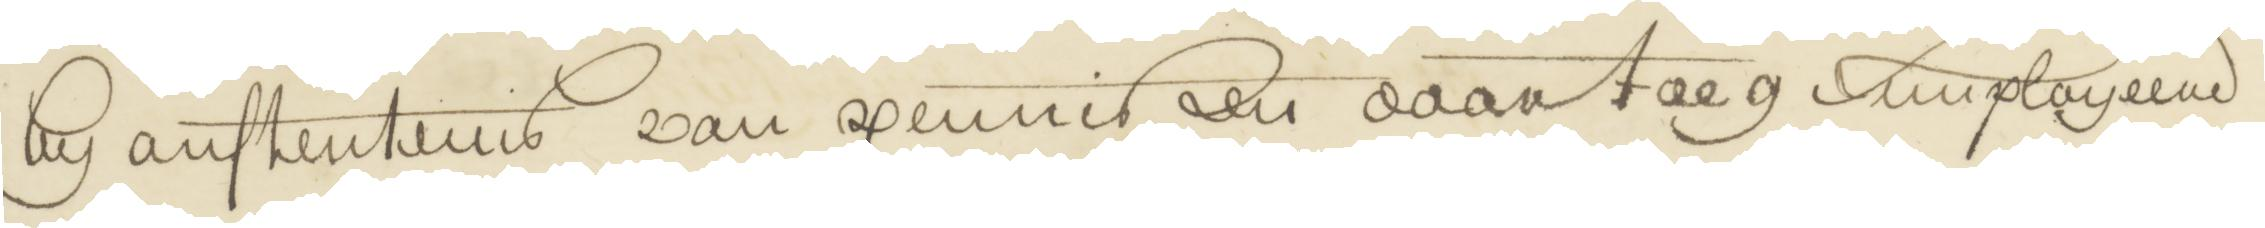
by anstentenis van pennisten daar toe g Emplayeerd
